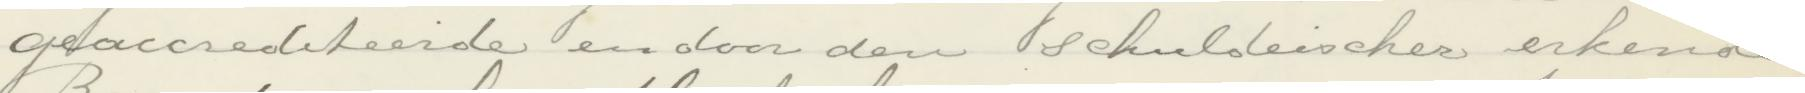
geaccrediteerde en door den schuldeischer erkende
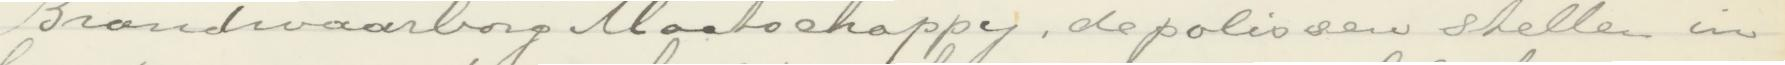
Brandwaarborg Maatschappij, de polissen stellen in
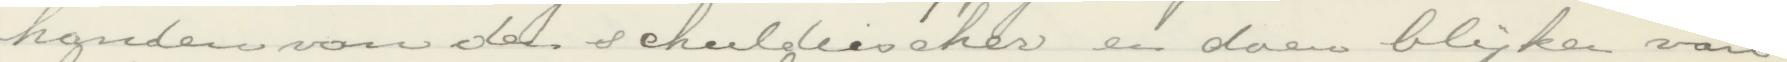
handen van den schuldeischer en doen blijken van
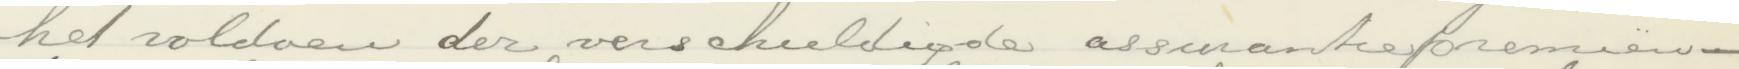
het voldoen der verschuldigde assurantie premiën
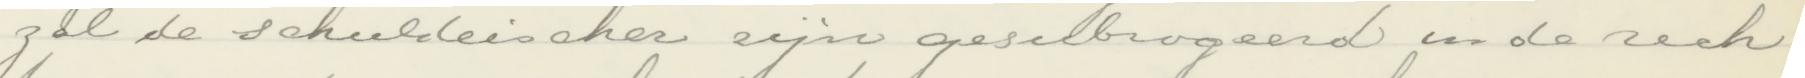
zal de schuldeischer zijn gesubrogeerd in de rech
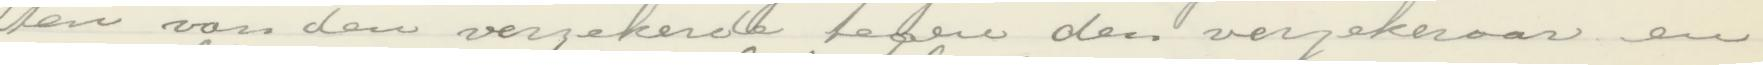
ten van den verzekerde tegen den verzekeraar en
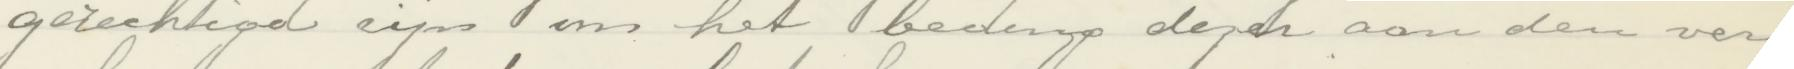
gerechtigd zijn om het beding dezer aan den ver
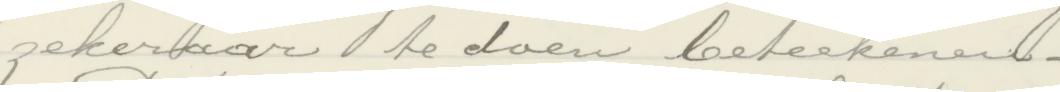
zekeraar te doen beteekenen
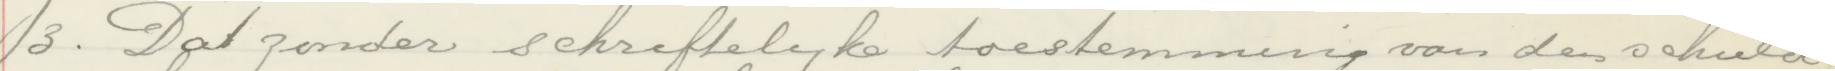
3. Dat zonder schriftelyke toestemming van den schuld
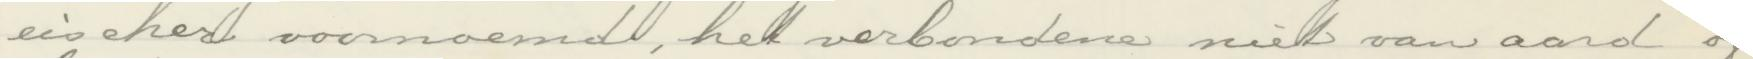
eischer voornoemd, het verbondene niet van aard of
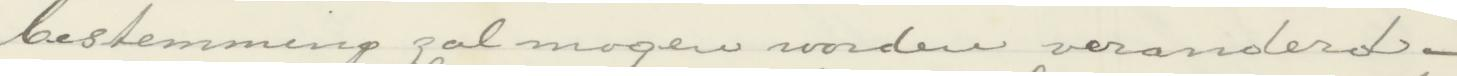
bestemming zal mogen worden veranderd
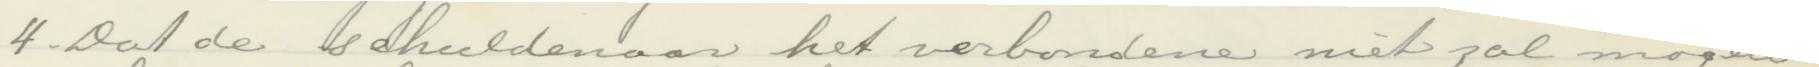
4. Dat de schuldenaar het verbondene niet zal mogen
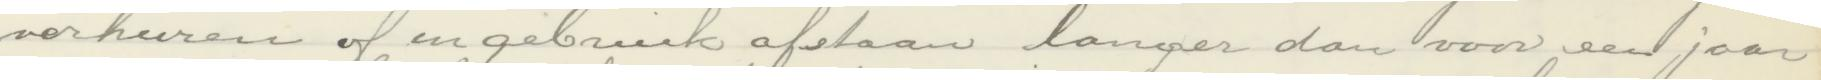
verhuren of in gebruik afstaan langer dan voor een jaar
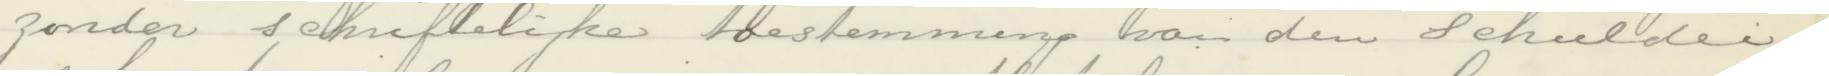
zonder schriftelijke toestemming van den schuldei-
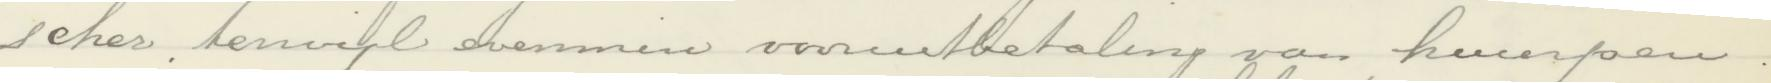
scher, terwijl evenmin vooruitbateling van huurpen
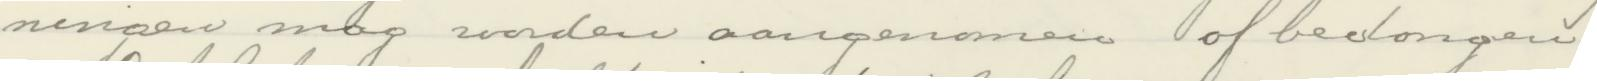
ningen mag worden aangenomen of bedongen
